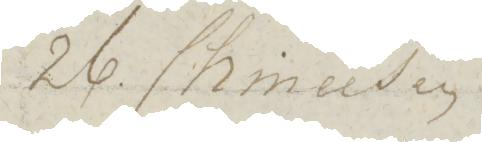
26. Chineesen
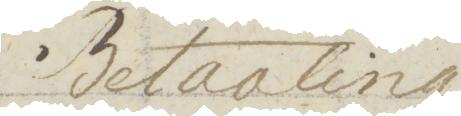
Betaaling
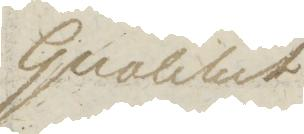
qualiteit
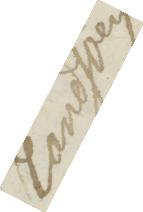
randsoen
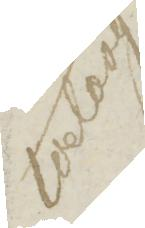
toelaag
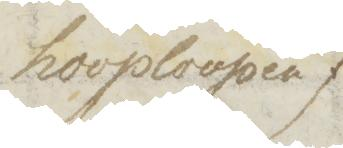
hooplooper ƒ
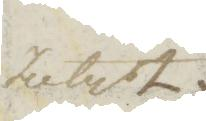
zie lyst.
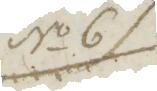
N_o 6/
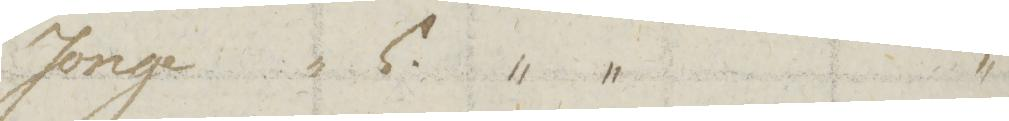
Jonge „ 5. „ „ „
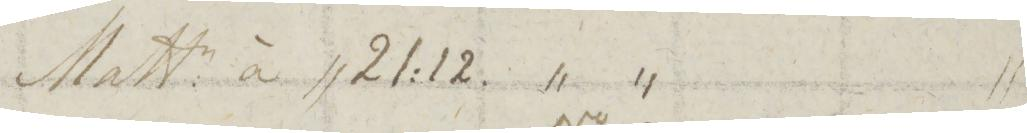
Matt:n à „ 21:12. „ „
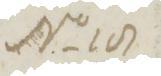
N_o 18
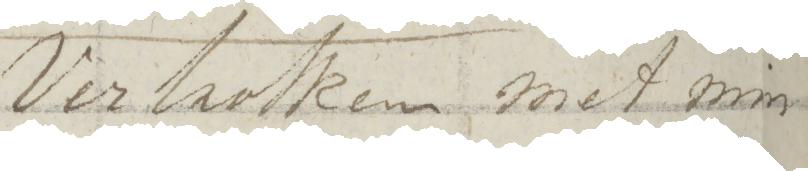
Vertrokken met min
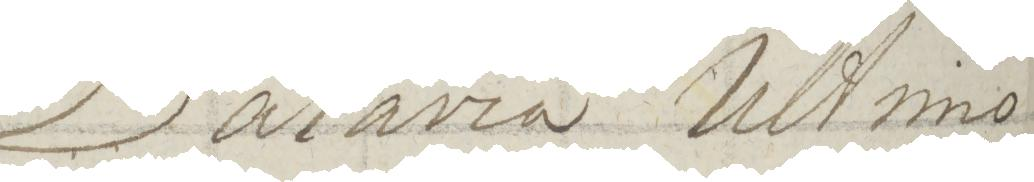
Batavia Ultimo
